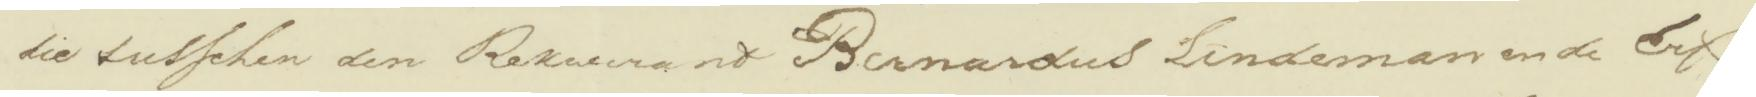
die tusschen den Rekwirant Bernardus Lindeman en de Erf.
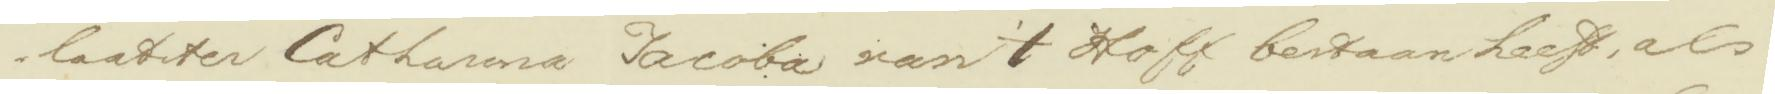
„laatster Catharina Iacoba van ’t Hoff bestaan heeft, als
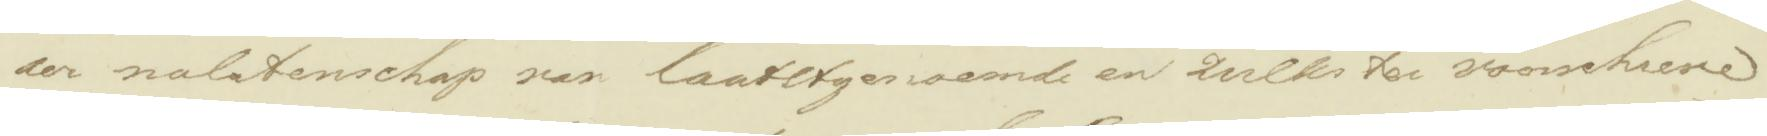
der nalatenschap van laatstgenoemde en zulks ter voorschreve
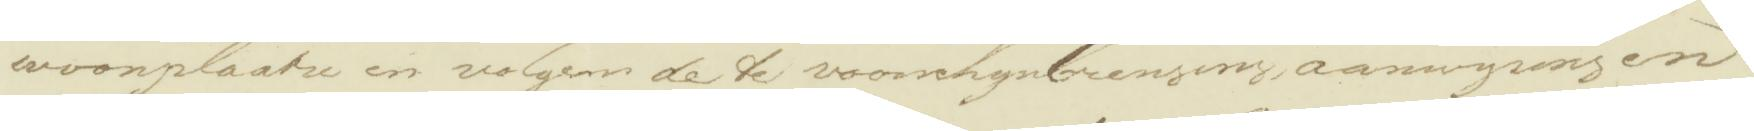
woonplaatse en volgen de te voorschynbrenging, aanwyzing en
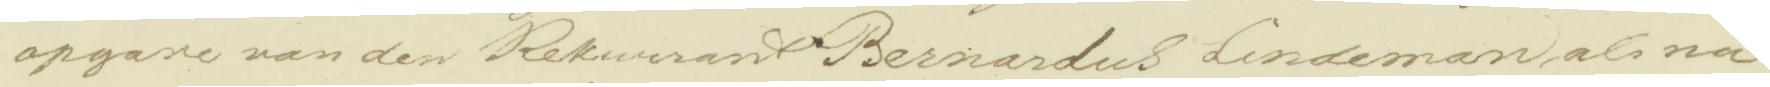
opgave van den Rekwirant Bernardus Lindeman, als na
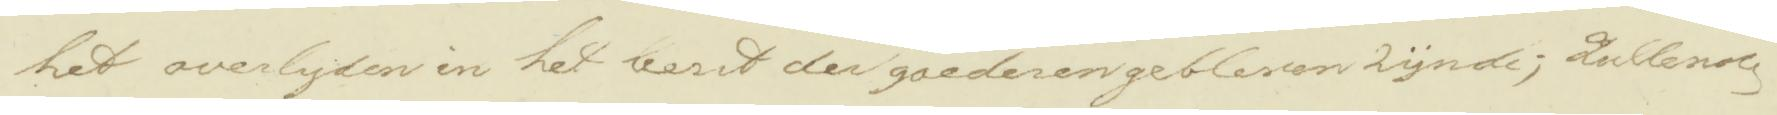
het overlyden in het bezit der goederen gebleven zijnde; zullende
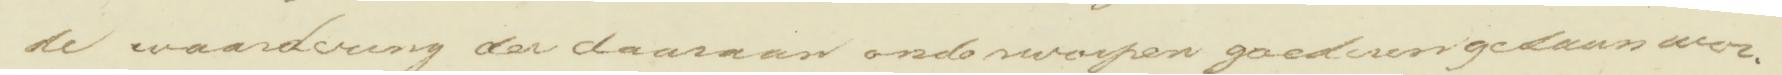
de waardering der daaraan onderworpen goederen gedaan wor„
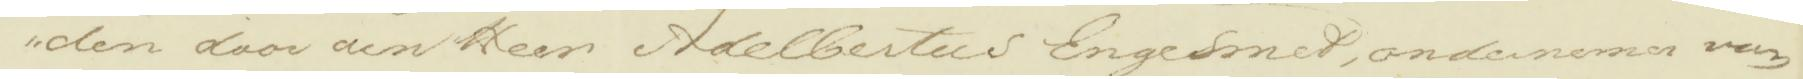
„den door den Heer Adelbertus Engesmet, ondernemer van
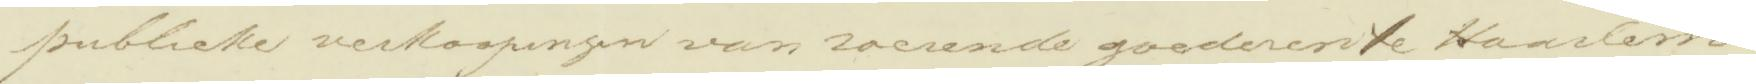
publieke verkoopingen van roerende goederen te Haarlem
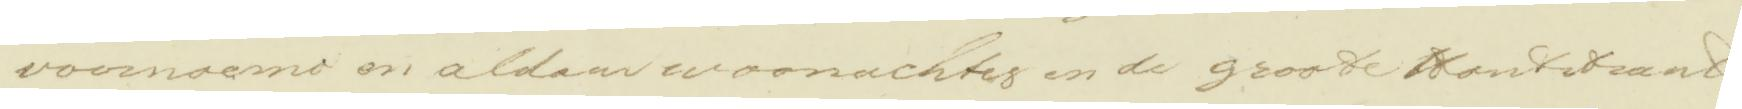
voornoemd en aldaar woonachtig in de groote Houtstraat
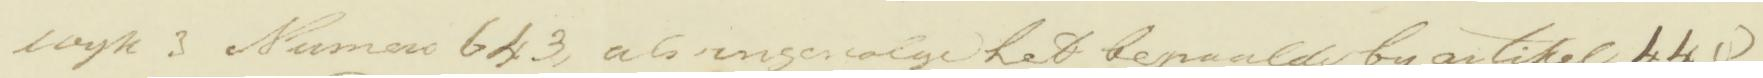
wyk 3 Numero 643, als ingevolge het bepaalde by artikel 448
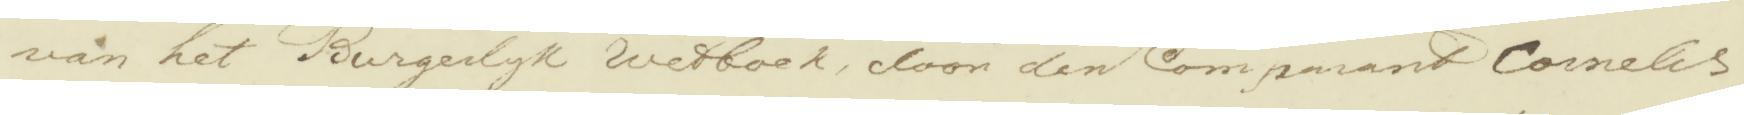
van het Burgerlyk wetboek, door den Comparant Cornelis
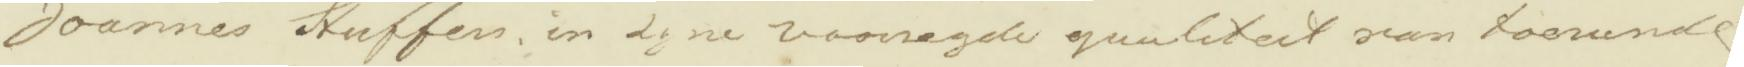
Joannes Stuffers, in zyne voorzegde qualiteit van toeziende
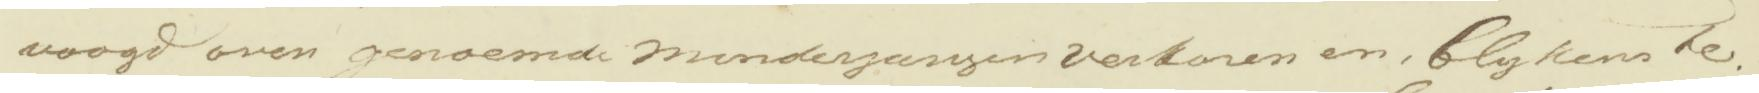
voogd over genoemde minderjarigen verkozen en, blykens be,
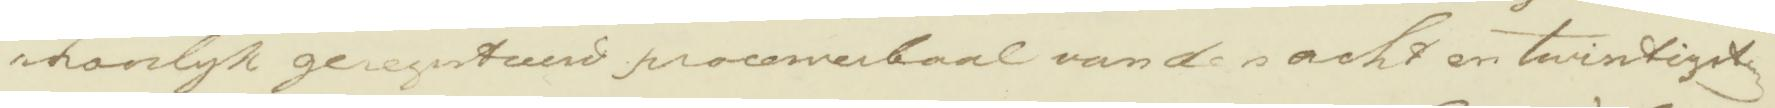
„hoorlyk geregistreerd procesverbaal van den acht en twintigsten
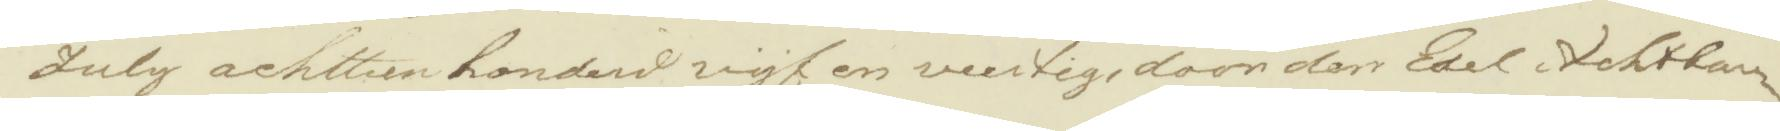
July achttien honderd vijf en veertig, door den Edel Achtbaren
